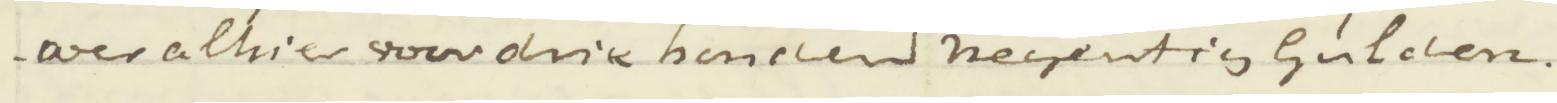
-wer alhier voor drie honderd negentig Gulden
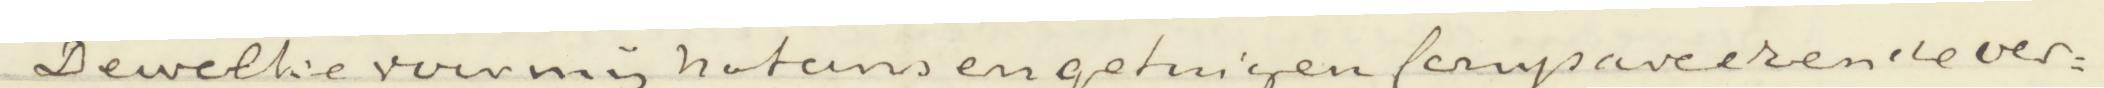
Dewelke voor mij notaris en getuigen Compareerende ver=
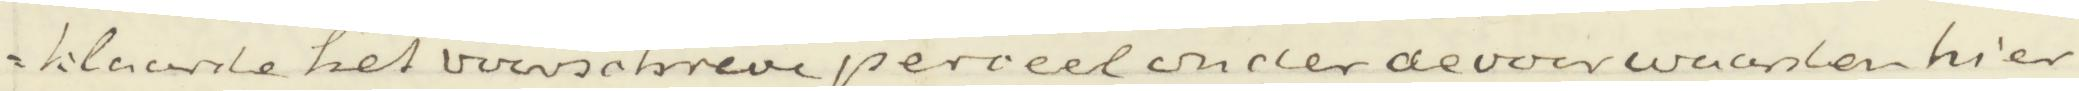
=klaarde het voorschreve perceel onder de voor waarden hier
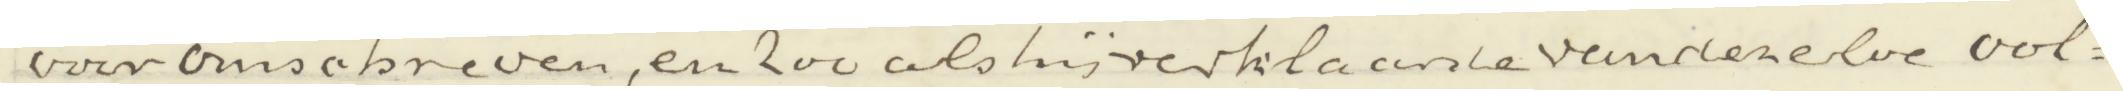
voor omschreven, en zoo als hij verklaarde van dezelve vol=
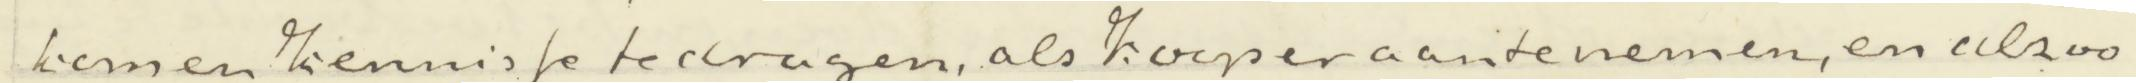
komen kennisse te dragen, als kooper aan te nemen, en alzoo
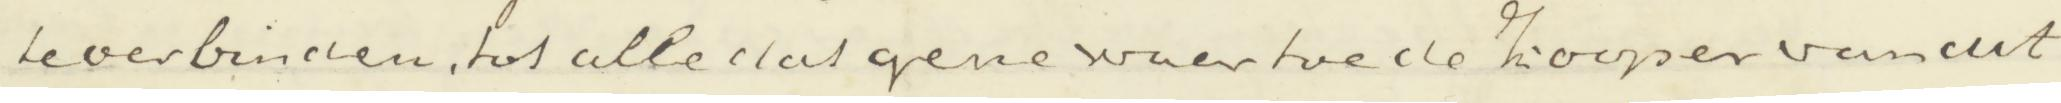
te verbinden, tot alle dat gene waartoe de kooper van dit
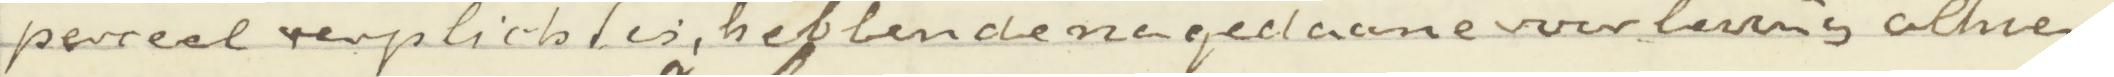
perceel verplicht is, hebbende na gedaane voorlezing alhier
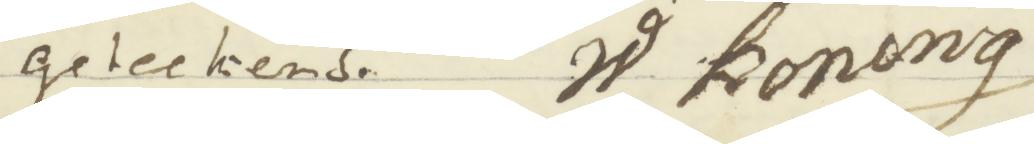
geteekend. W Koning
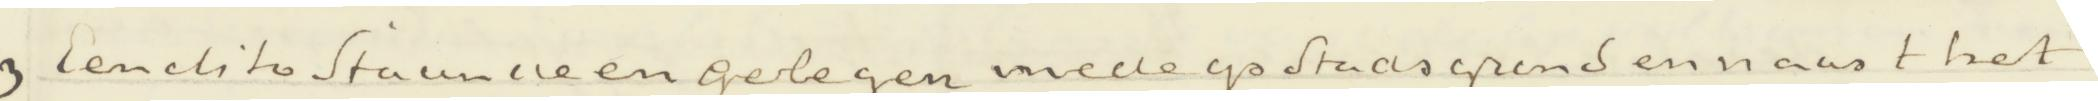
3 Een dito staande en Gelegen mede op stads grond en naast het
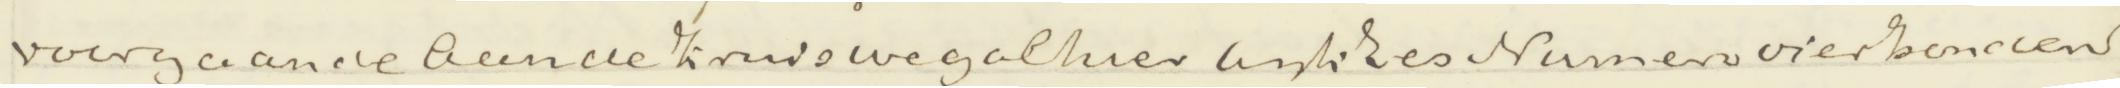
voorgaande aan de kruisweg alhier wyk zes Numero vierhonderd
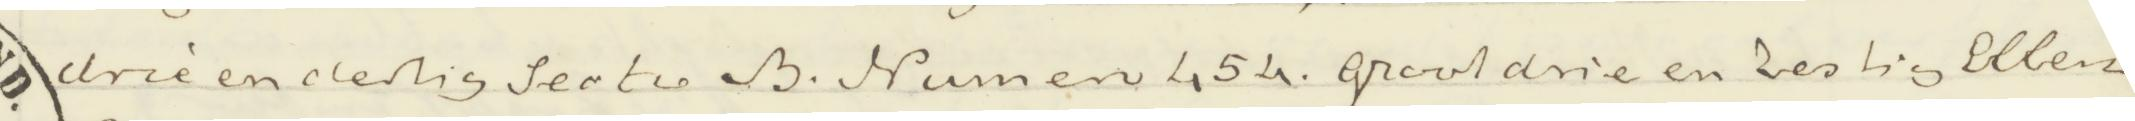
drie en dertig sectie B. Numero 454. Groot drie en zestig Ellen
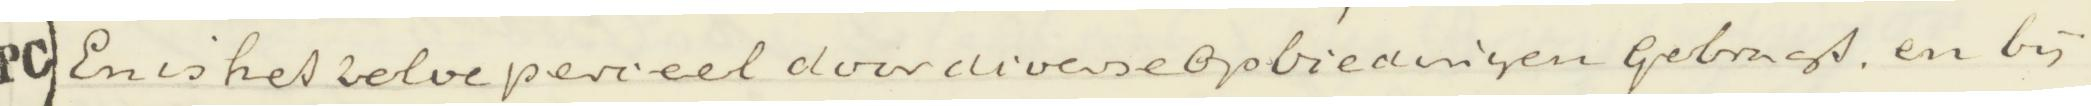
En is het zelve perceel door diverse opbiedingen Gebragt, en bij
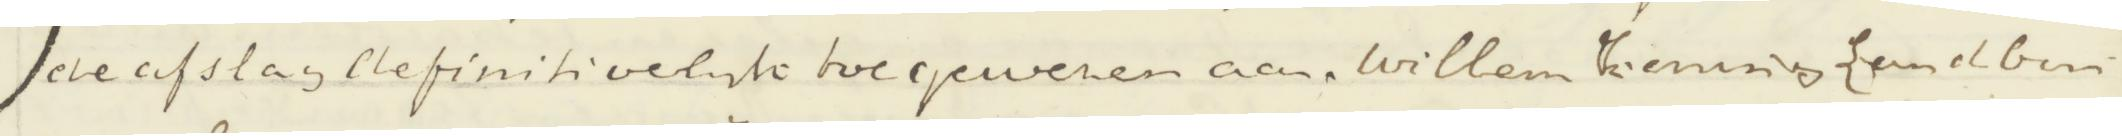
de afslag definitivelyk toe gewezen aan, willem koning Landbou
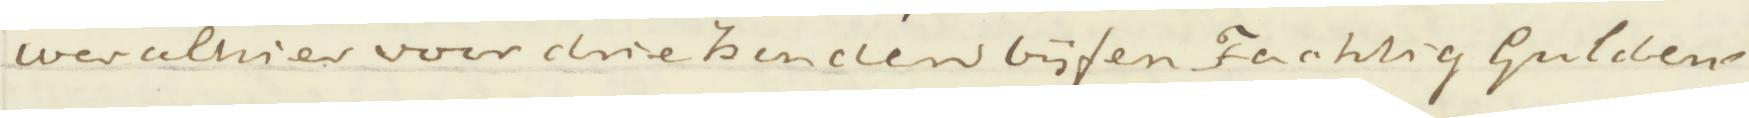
wer alhier voor drie honderd vijf en Tachtig Guldens
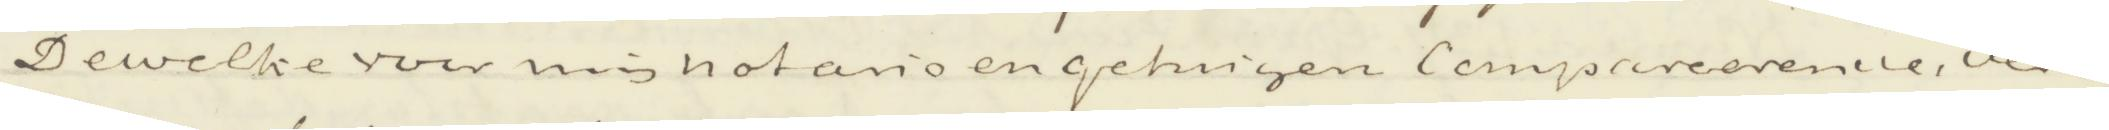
Dewelke voor mij notaris en getuigen Compareerende, ver=
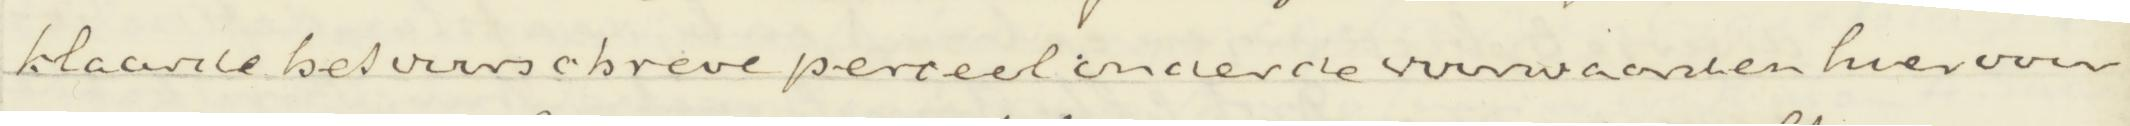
klaarde het voorschreve perceel onder de voorwaarden hier voor
